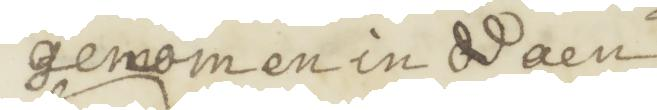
genomen in de aen
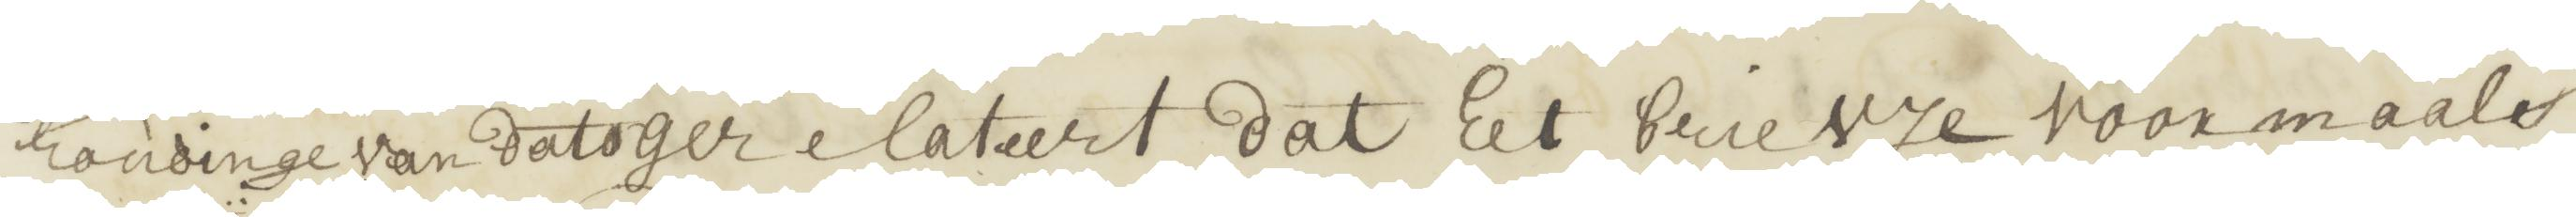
houdinge van dato gerelateert dat het brievje voormaals
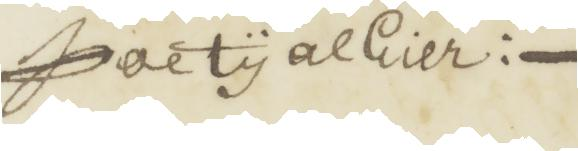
poetij alhier: — .
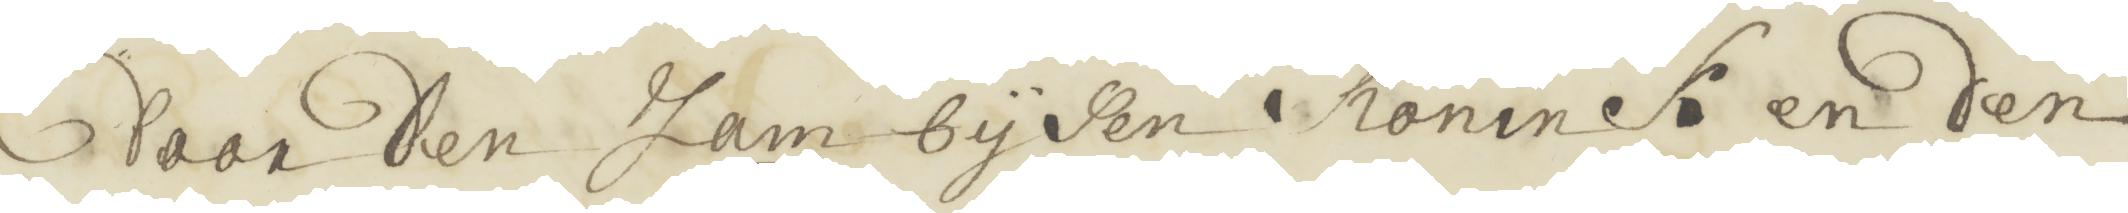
door den Jambijsen konink en den
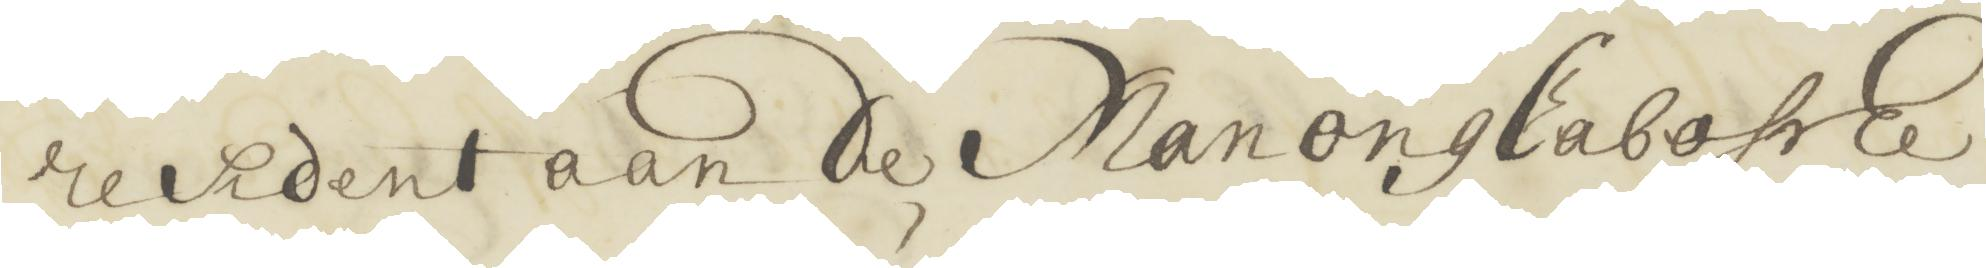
resident aan de Manongcabosche
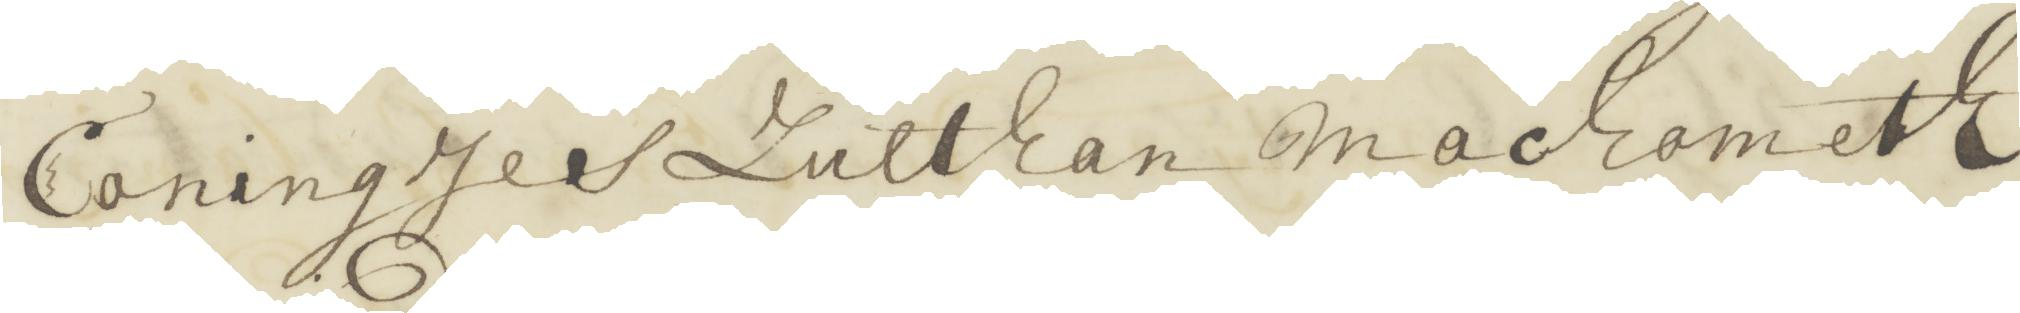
Coningjes Zulthan machometh
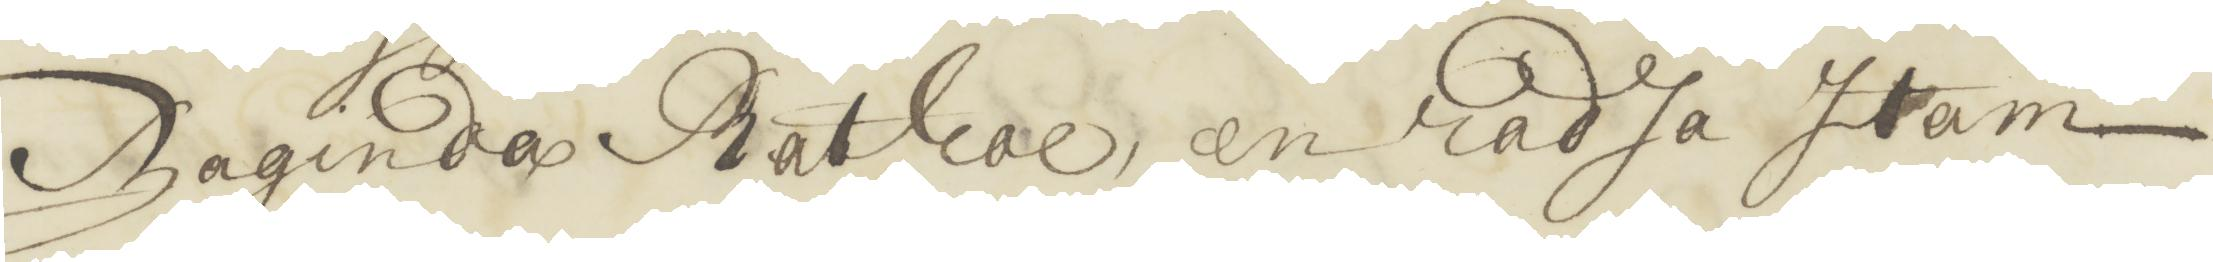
Baginda Rathoe, en radja jtam
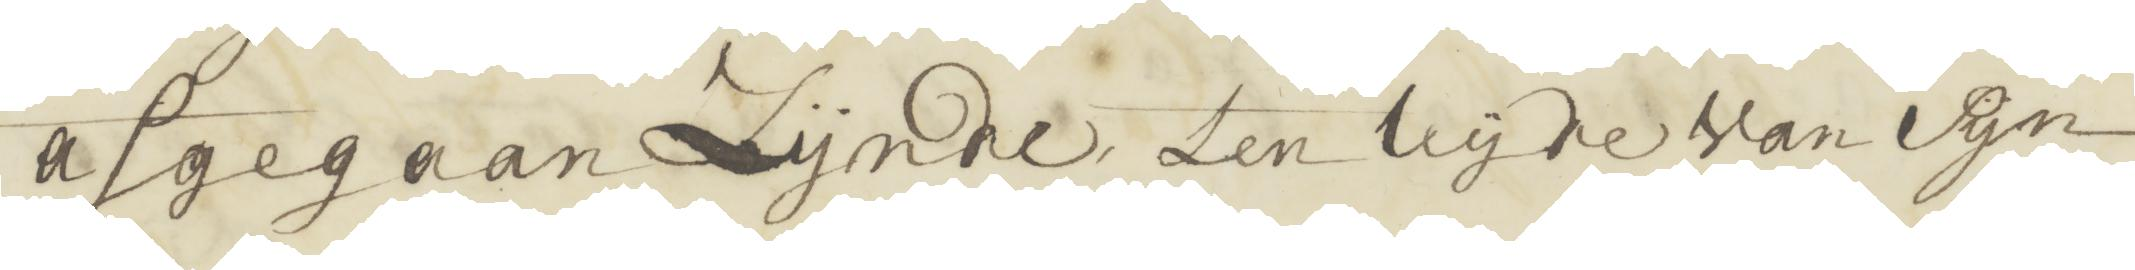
afgegaan zijnde, ten teijre van sijn
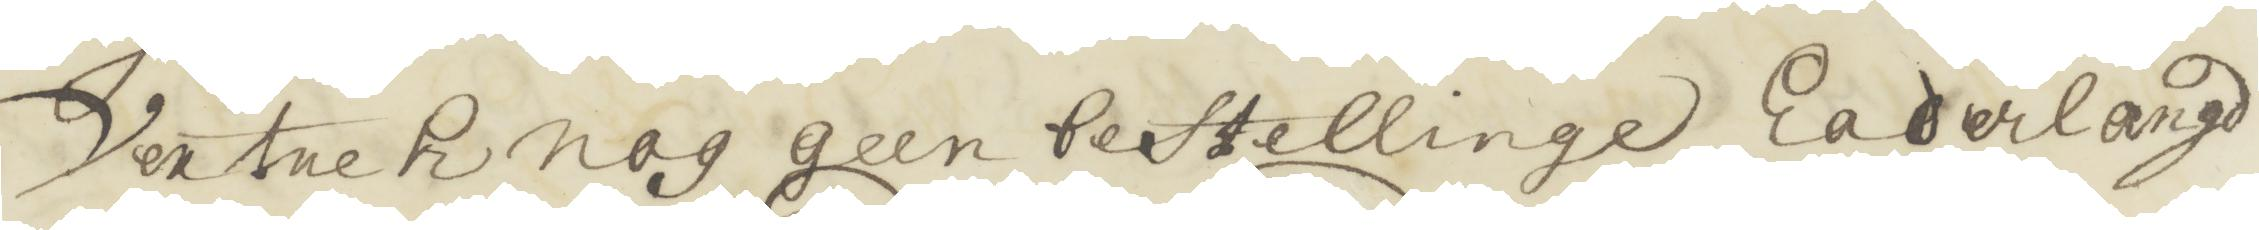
Vertrek nog geen bestellinge had erlangd
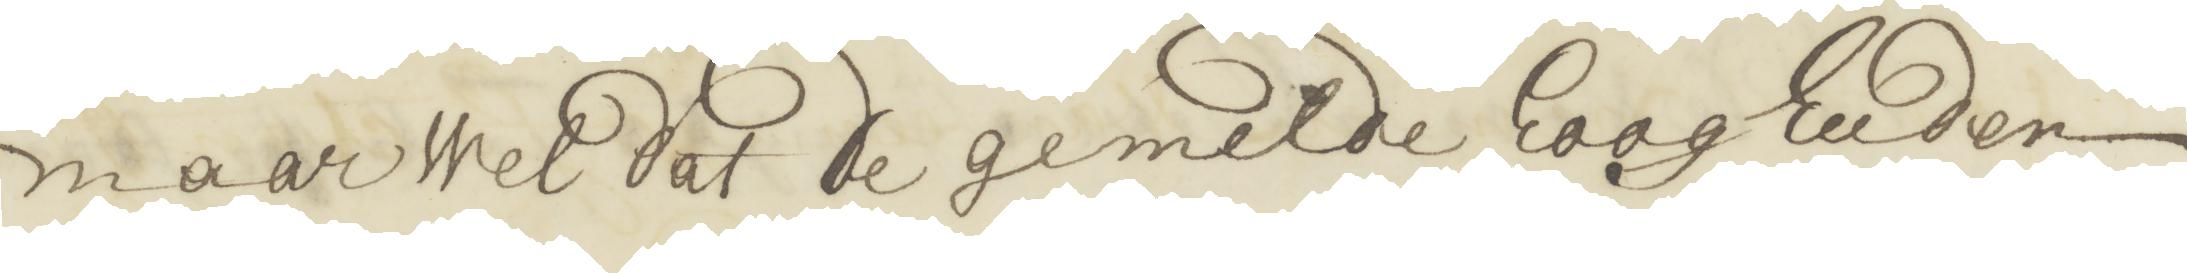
maar wel dat de gemelde Hoogheeden
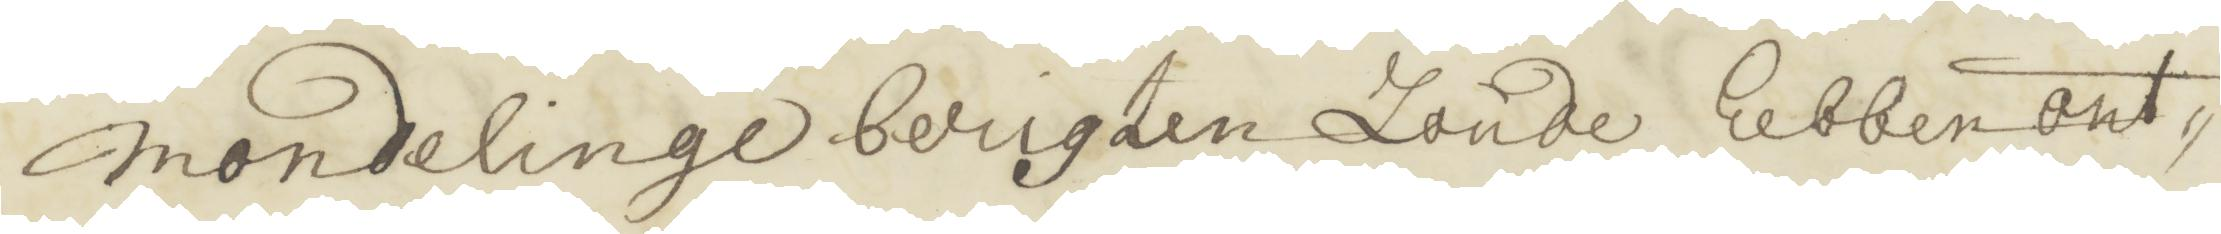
mondelinge berigten zoude hebben ont„
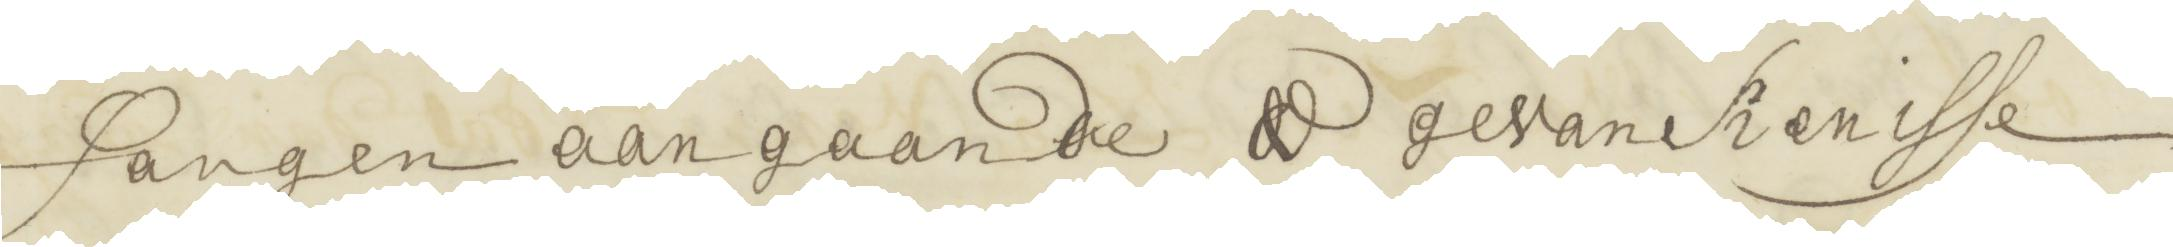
fangen aangaande de gevankenisse
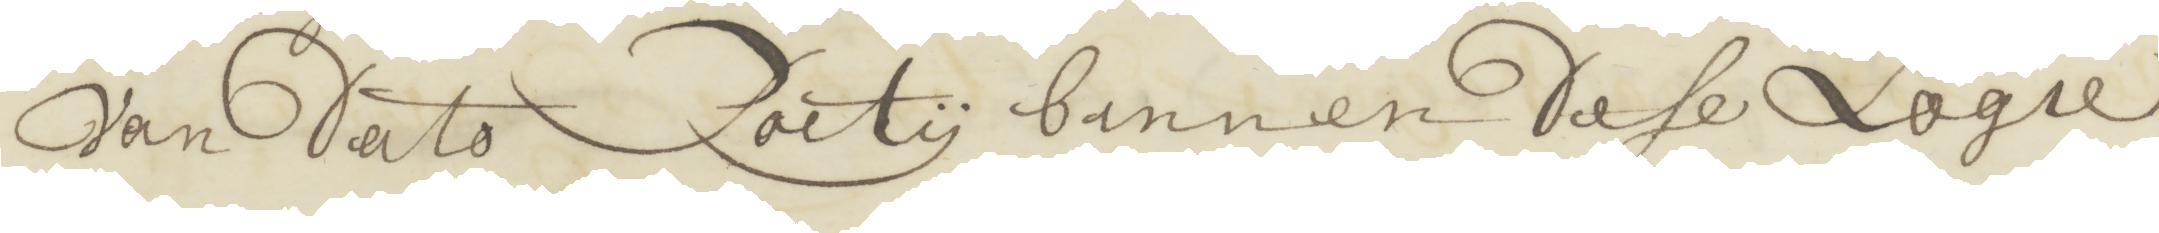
van dato Poetij binnen dese Logie
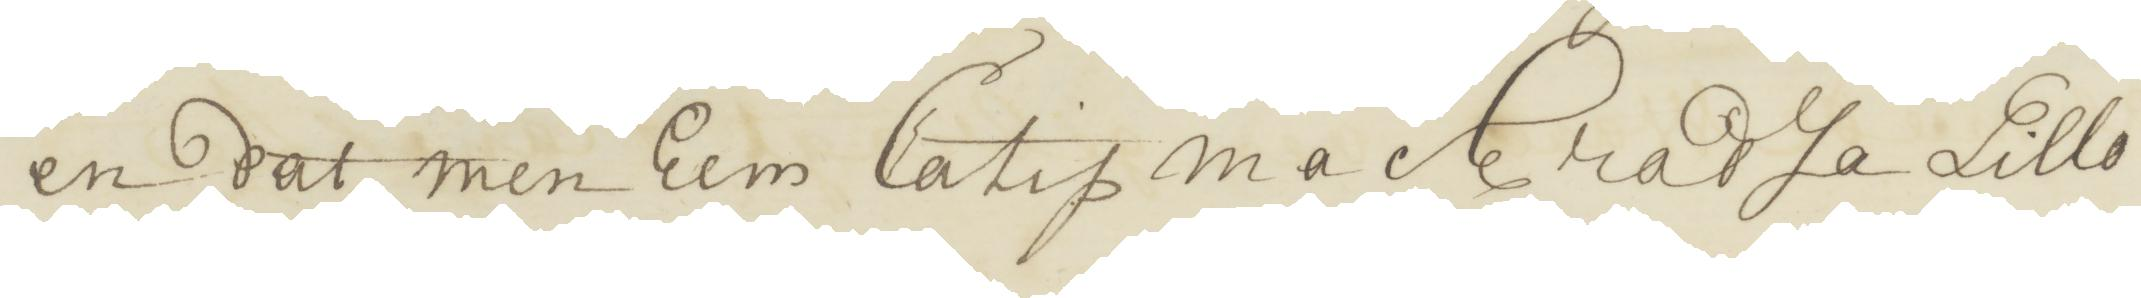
en dat men hem Catip machradja Lillo
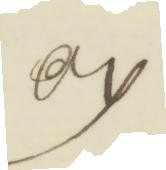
by
